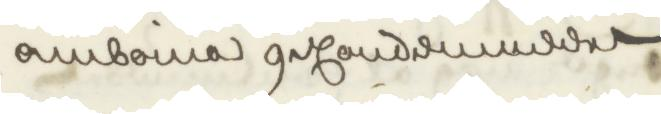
amboina gecondenmeert
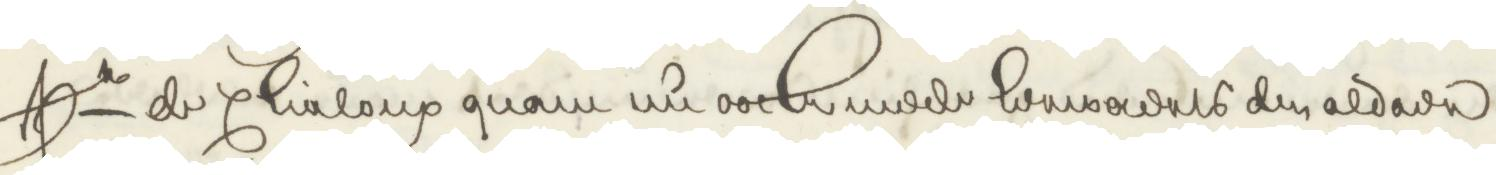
P=r de Chialoup quam nu oock mede herwaerts den aldaer
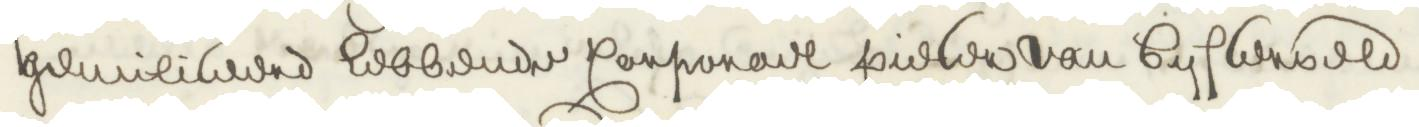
gemiliteerd hebbende Corporael pieter van bijsterveld
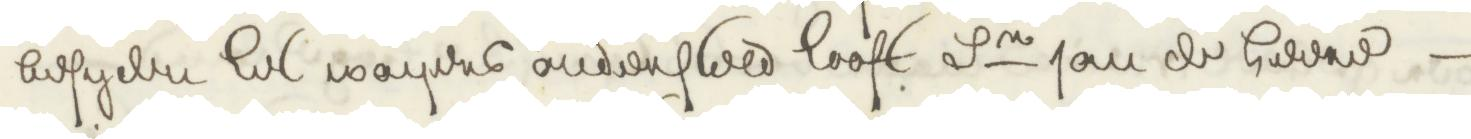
besijden het waijers ondersteld hooft s=r jan de heere —
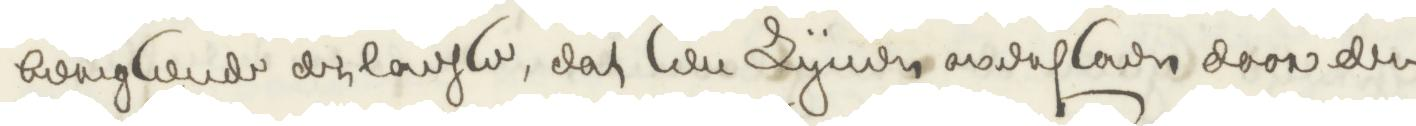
berigtende den laeste, dat ten zijnen overstaen door den
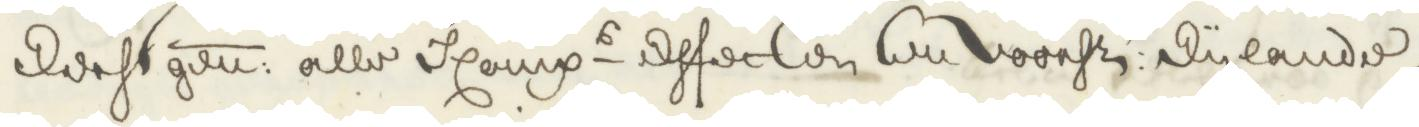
Eerst gen: alle sComp=s effecten ten voorsz: Eijlande
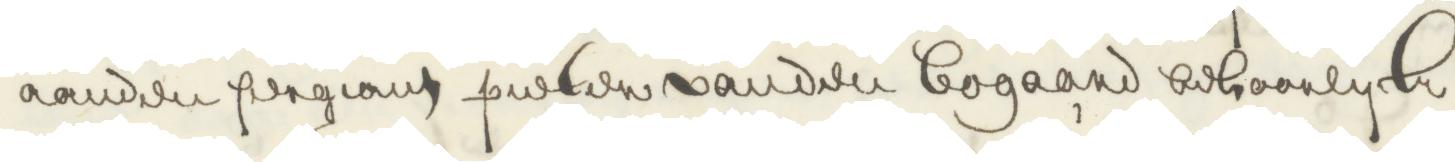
aanden sergiant pieter vanden bogaard behoorlyk
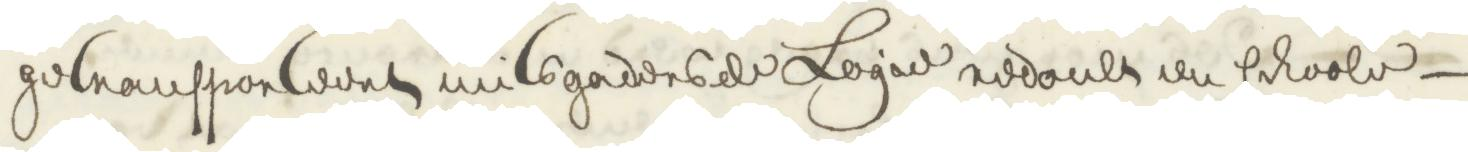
getransporteert mitsgaders de Logie redoult en schoole —
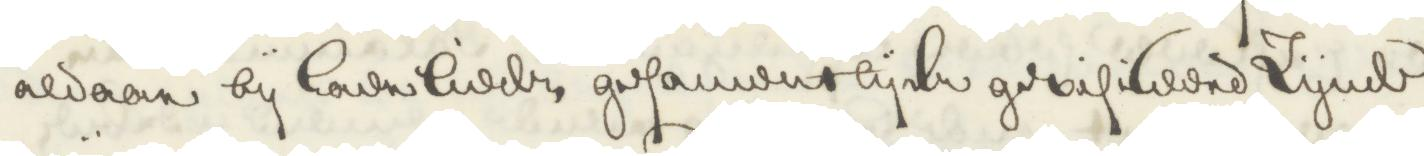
aldaar bij haer lieden gesamentlijck gevisiteerd zijnde
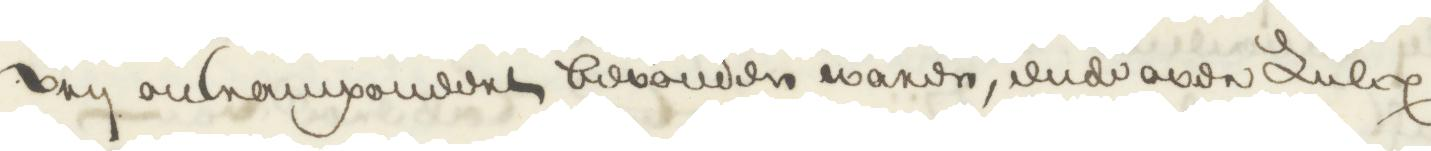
vrij ontramponeert bevonden waren, ende over zulcx
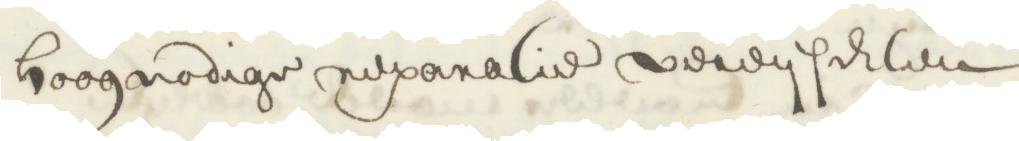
hoognodige reparatie vereijschten
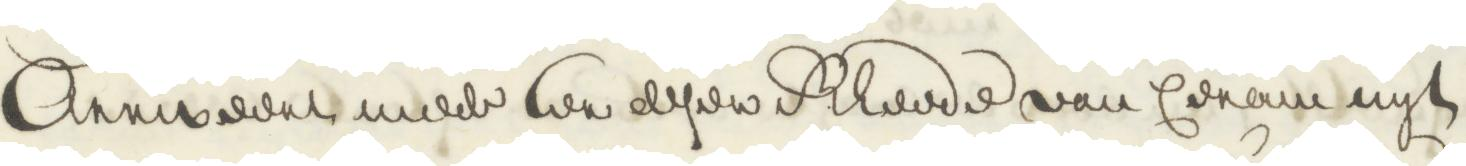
Arriveert mede ter deser Rheede van Ceram uyt
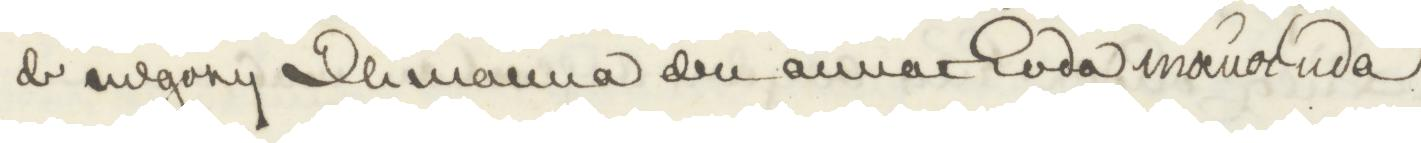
de negory Elimanna den annachoda mauoenda
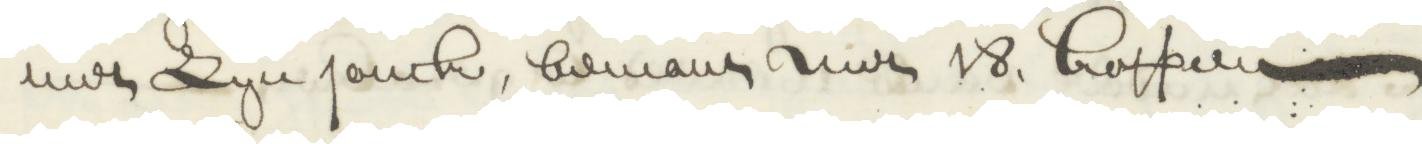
met zijn jonck, bemant met 18. koppen
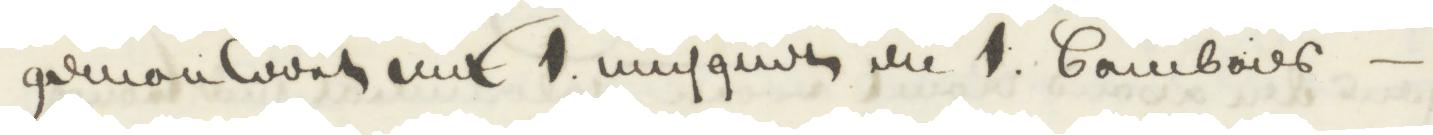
gemonteert met 1. musquet en 1: bamboes —
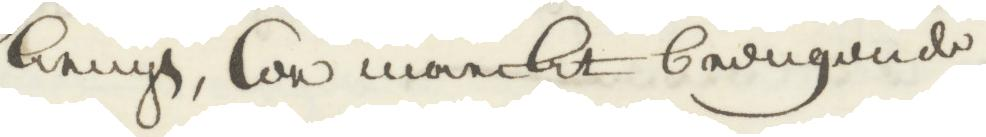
kruijt, ter marckt brengende
